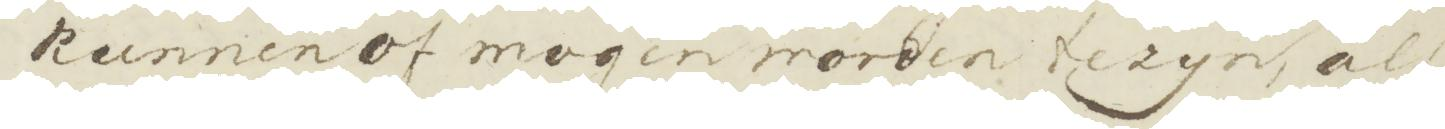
kunnen of mogen worden te zyn, als
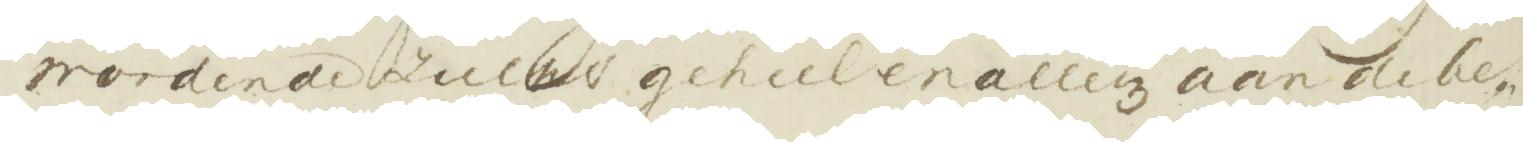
wordende zulks geheel en allen aan de be„
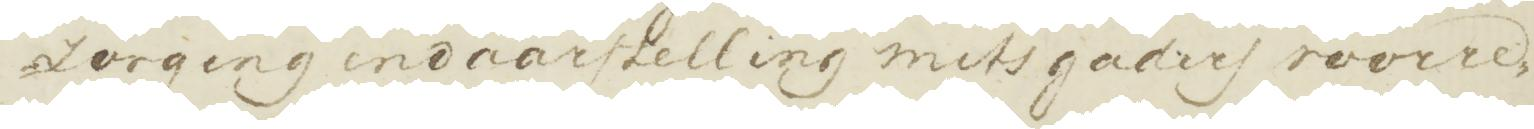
zorging en daarstelling mitsgaders voor re„
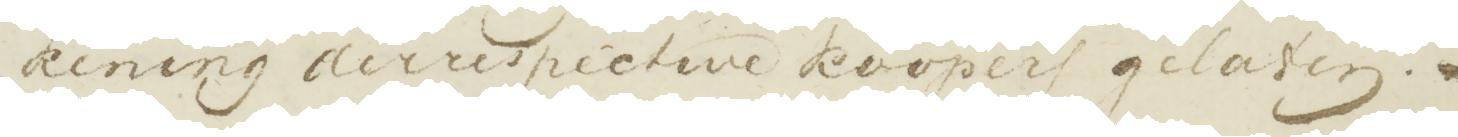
kening der respective koopers gelaten.-
